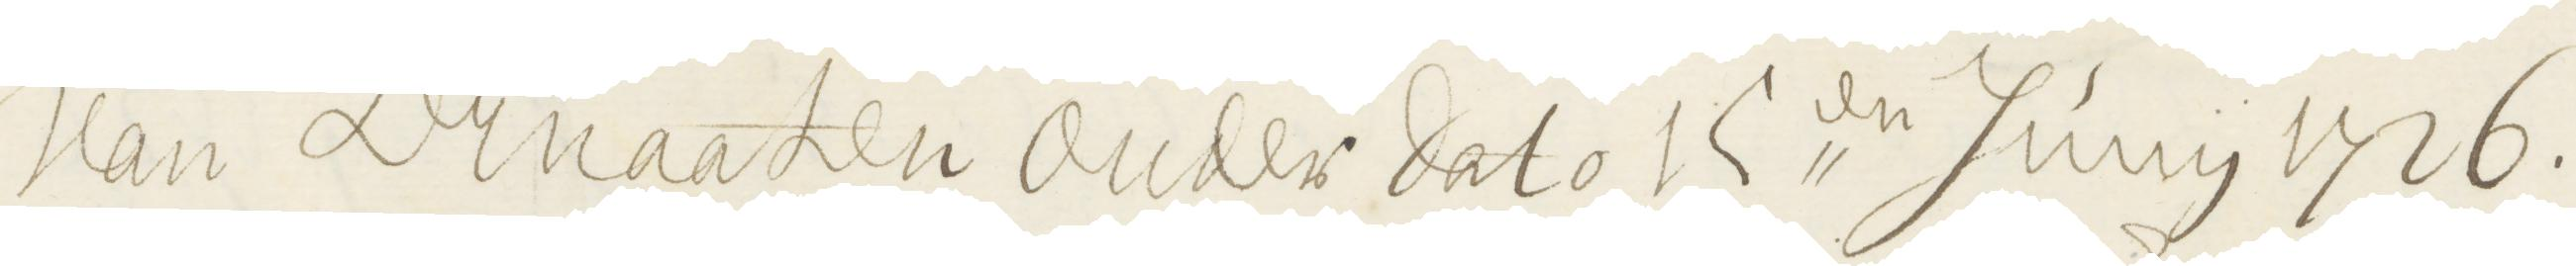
Van Ternaaten onder dato 15„en Junij 1726.
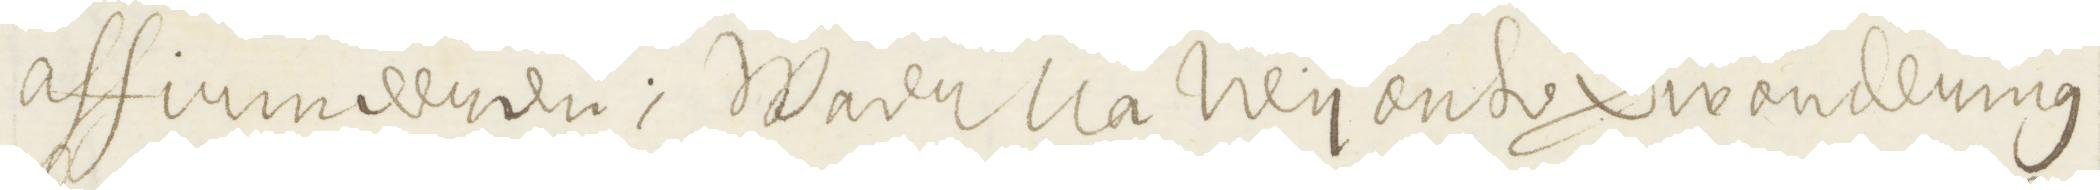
affirmeeren; waer na wij onse verwondering
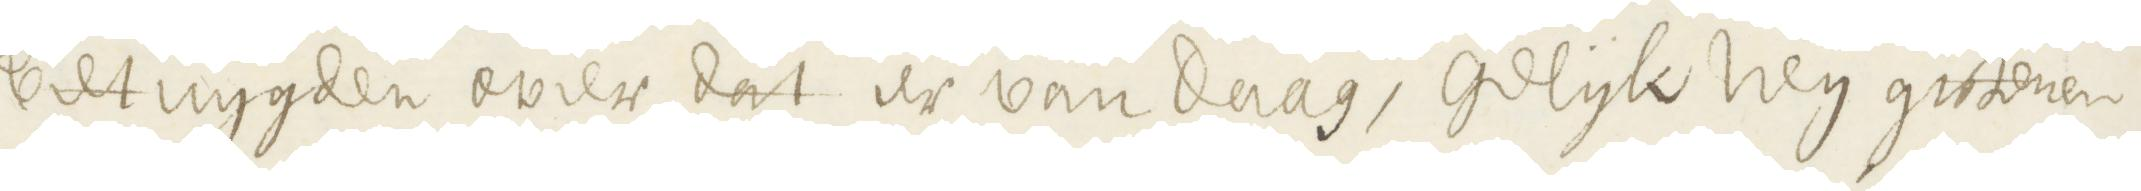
betuijgden over dat 'er van daag, gelijk wij gisteren
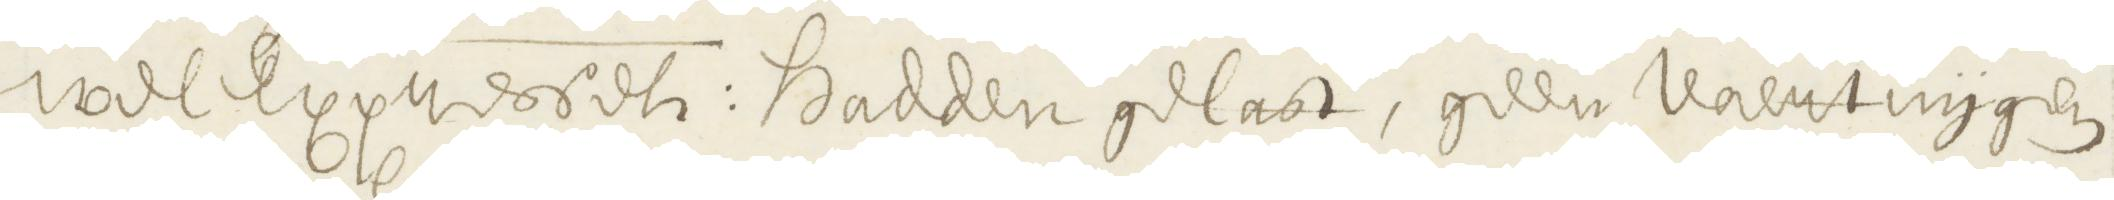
wel Expresselijk hadden gelast, geen vaertuijgen
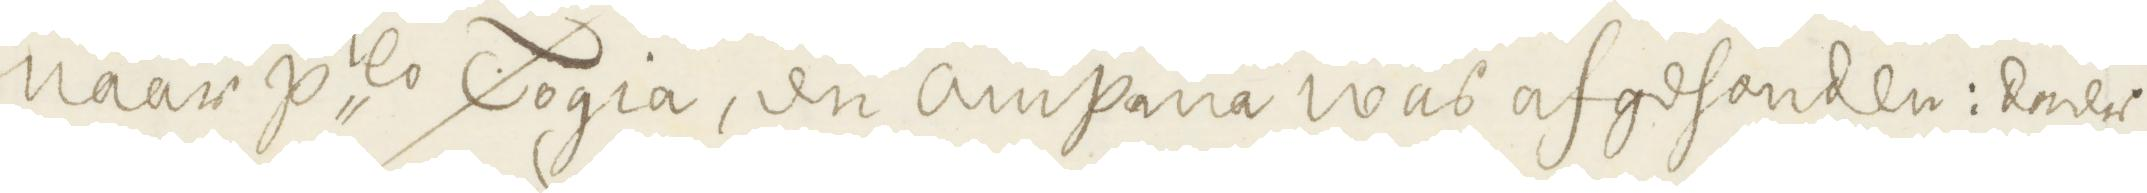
naar p„lo Togia, en ampana was afgesonden: daer
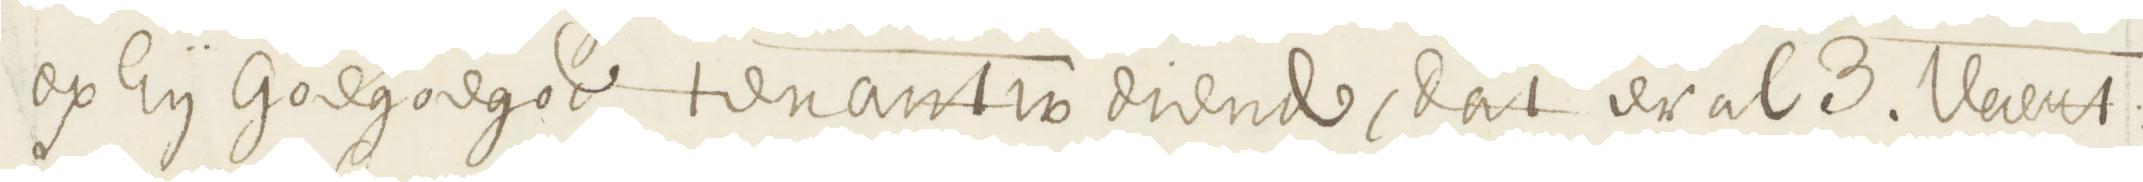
op hij goegoegoe ten antw diende, dat 'er al 3. Vaert
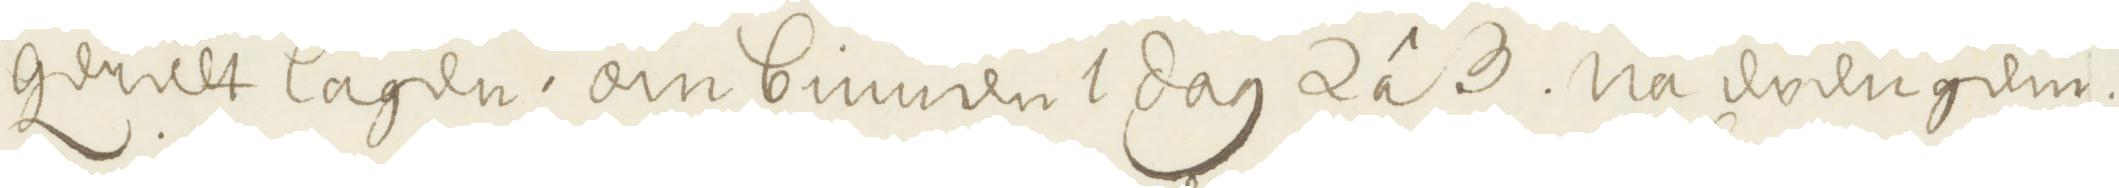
gereet lagen, om binnen 1 dag 2 â 3. na even gem.
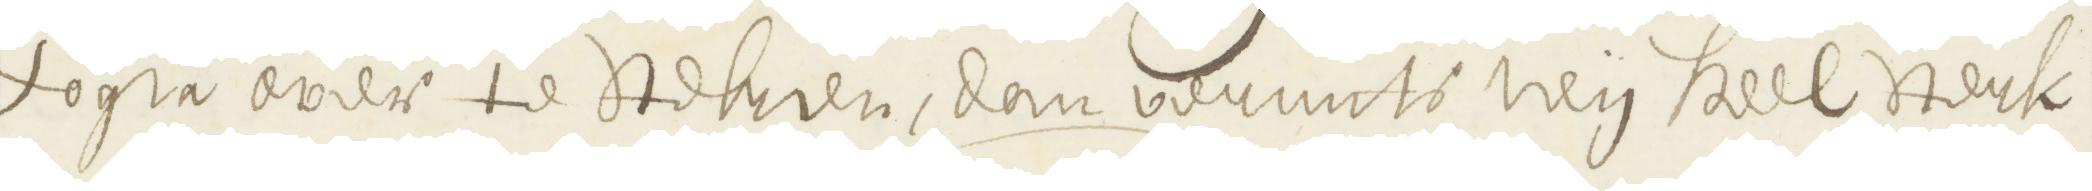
Togia over te steken, dan vermits wij heel sterk
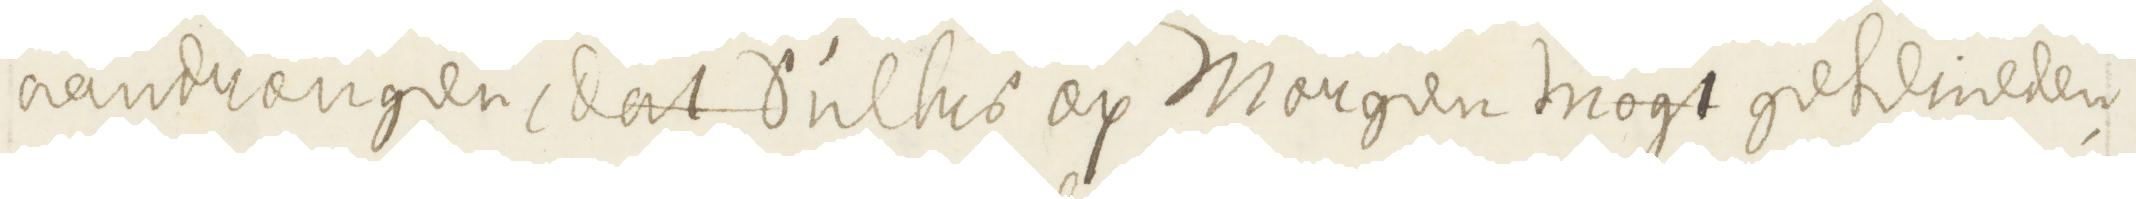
aandrongen, dat sulks op morgen mogt geschieden
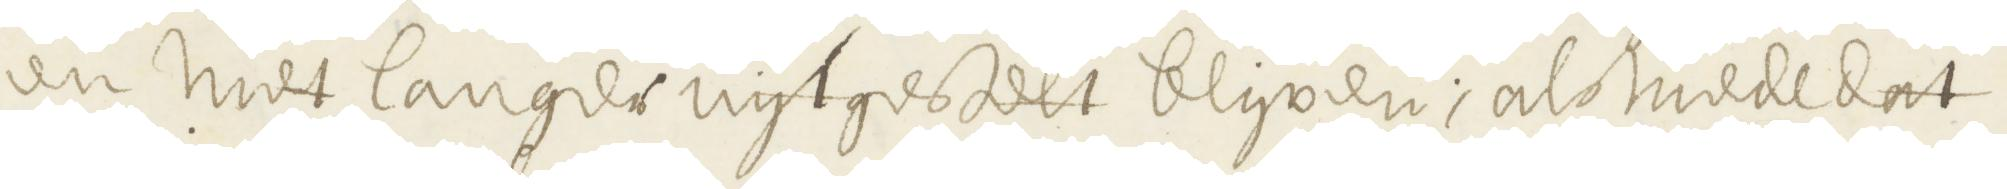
en niet langer uijtgestelt blijven; als mede dat
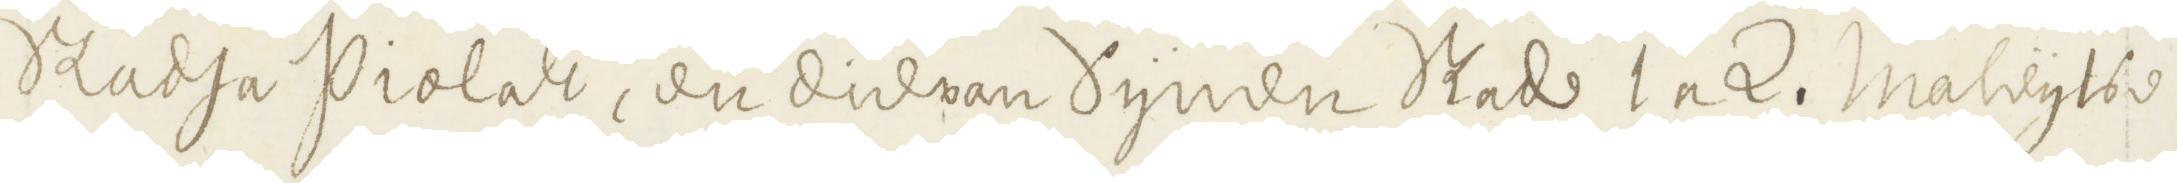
Radja Piolah, en die van Sijnen Rade 1 a 2. Maleijtse
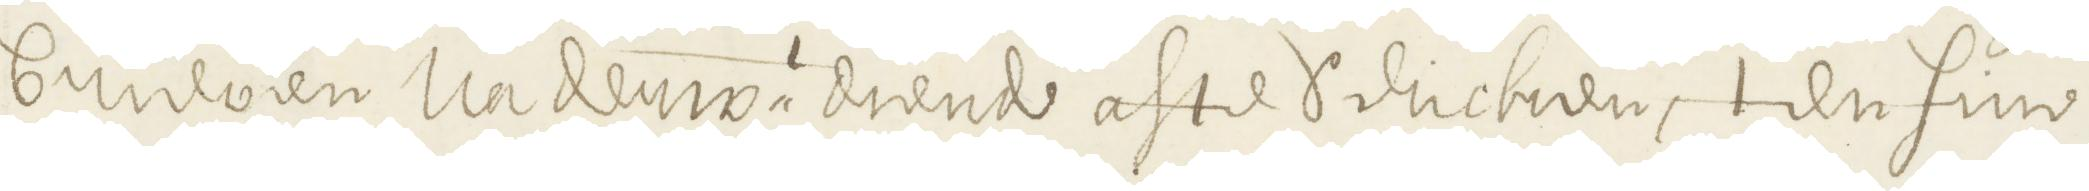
brieven na derw„t diende afte schicken, ten fine
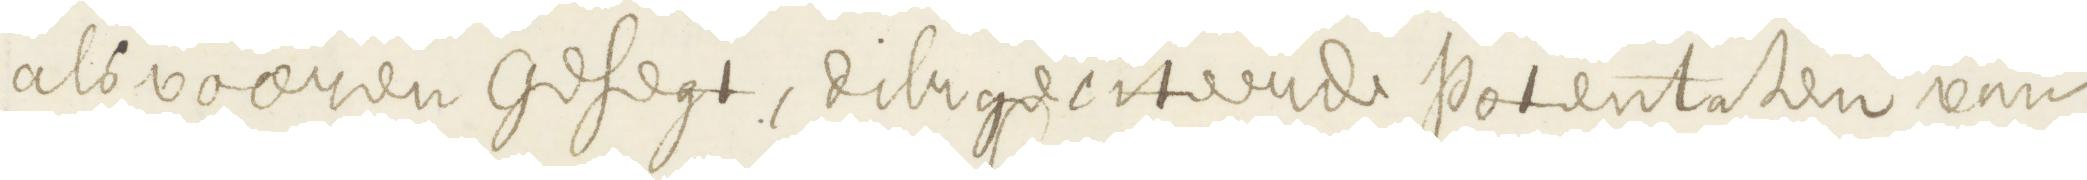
als vooren gesegt, dik geciteerde potentaten van
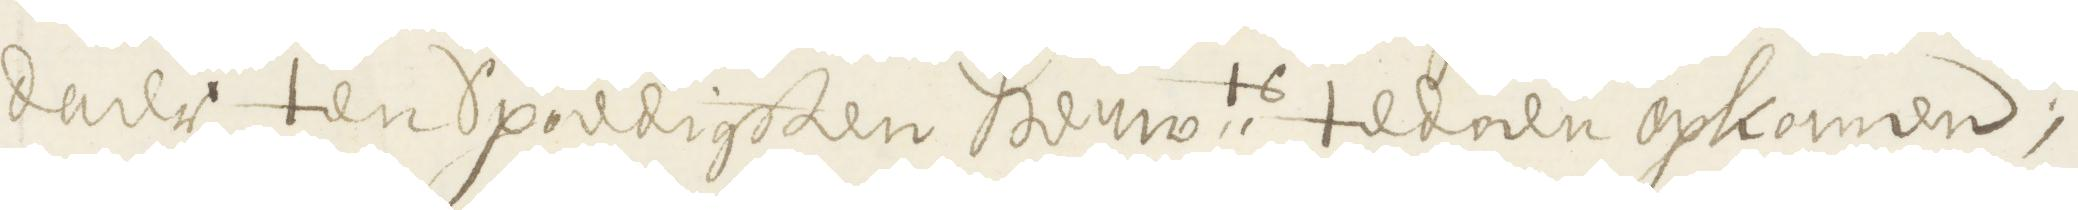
daer ten spoedigsten herw„ts te doen opkomen;
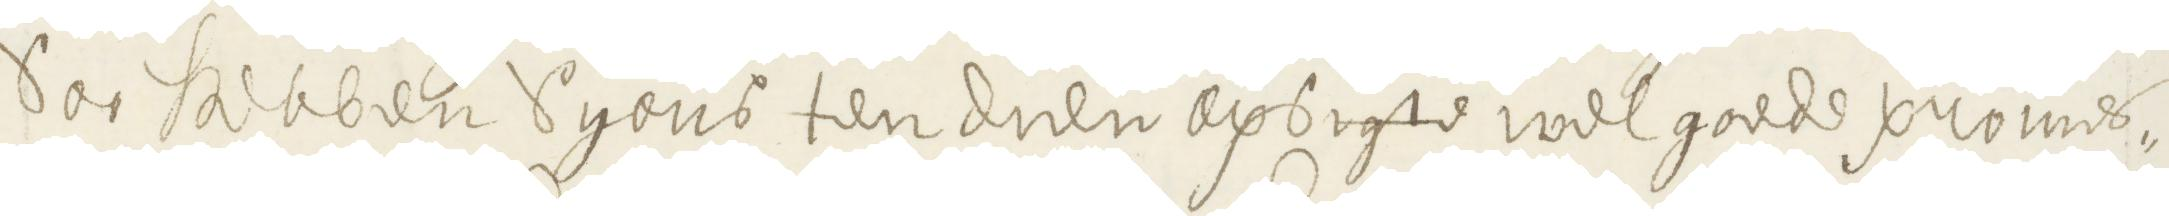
Soo hebben sij ons ten dien opsigte wel goede promes„
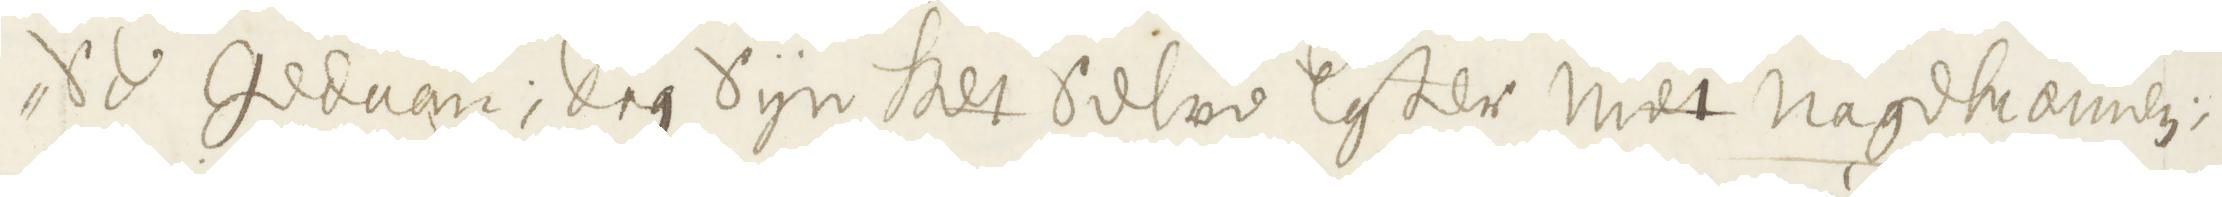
„se Gedaan; dog Sijn het selve Egter niet nagekomen;
